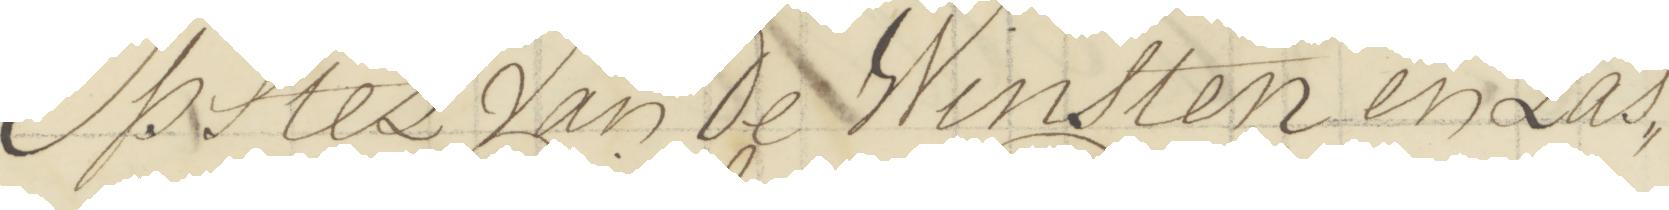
Opstel van de Winsten en Las„
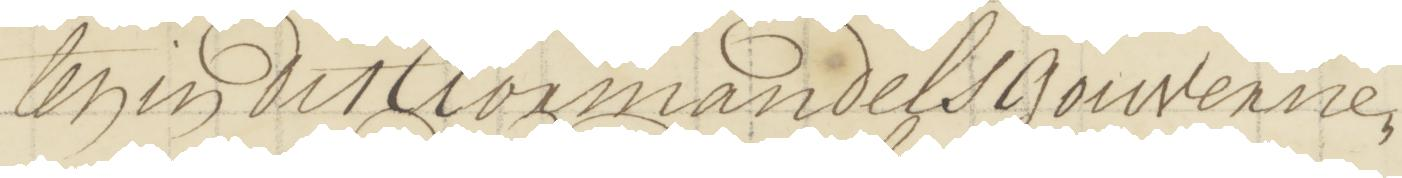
ten in dit Chormandels gouverne„
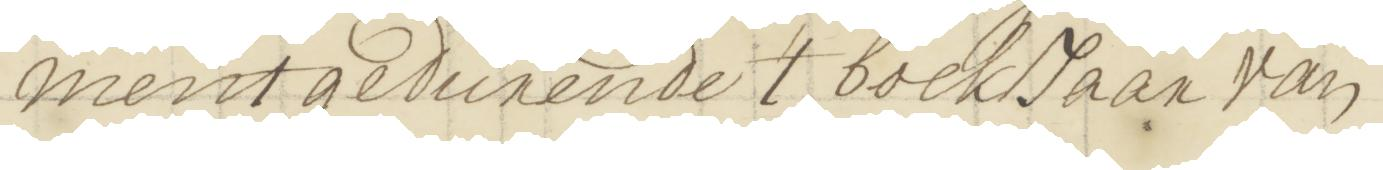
ment gedurende ’t boekJaar van
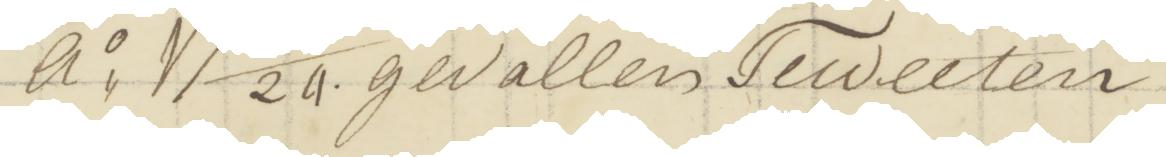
a„o 17 23/24. gevallen Teweeten
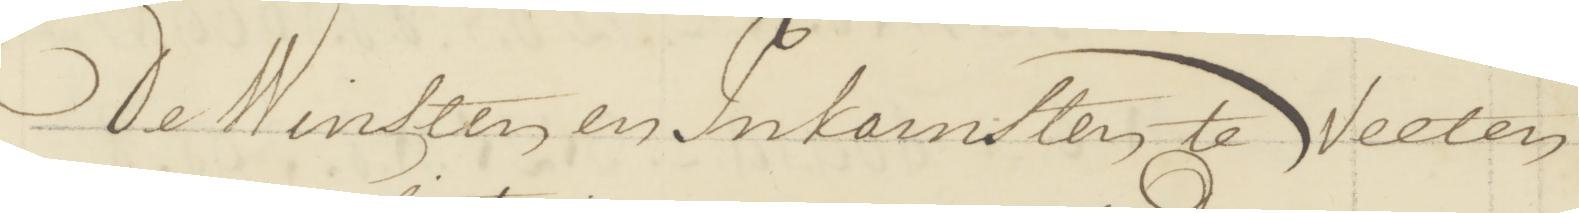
de Winsten en Inkomsten te Weeten
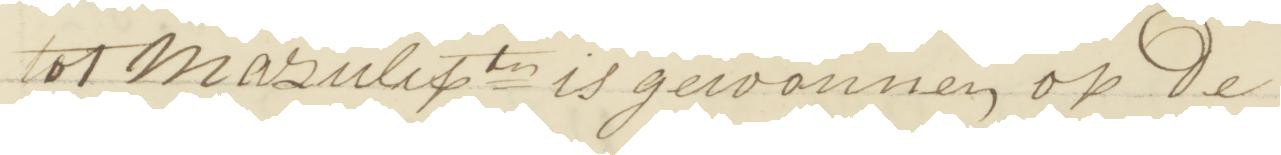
tot mazulip=tn is gewonnen op de
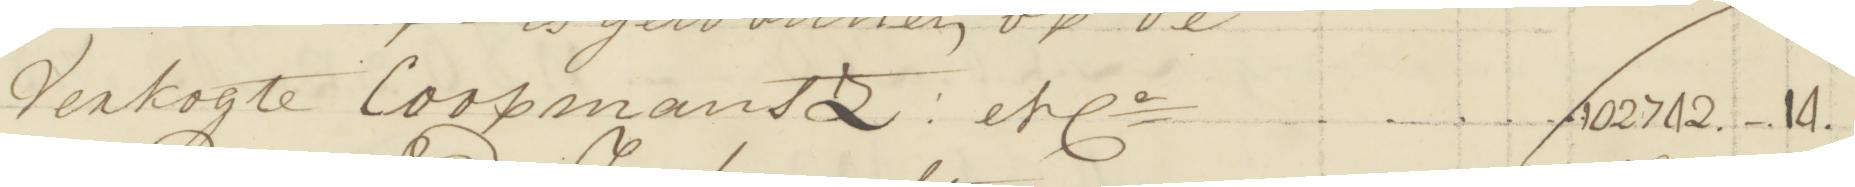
Verkogte Coopmansz: et C=a . . . . ƒ102742.-.14.
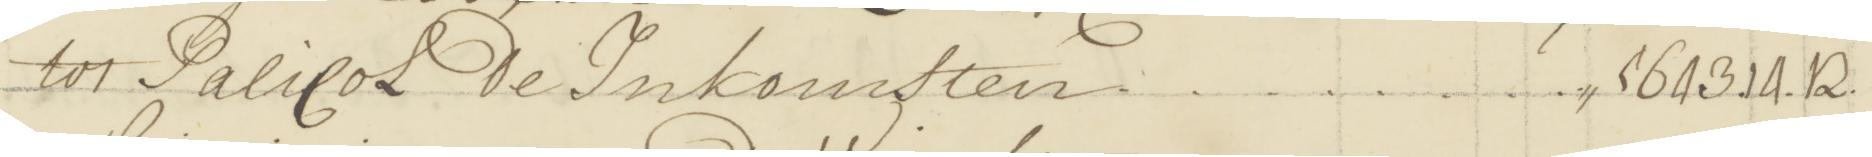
tot Palicol de Inkomsten . . . . . . . „ 564314.12.
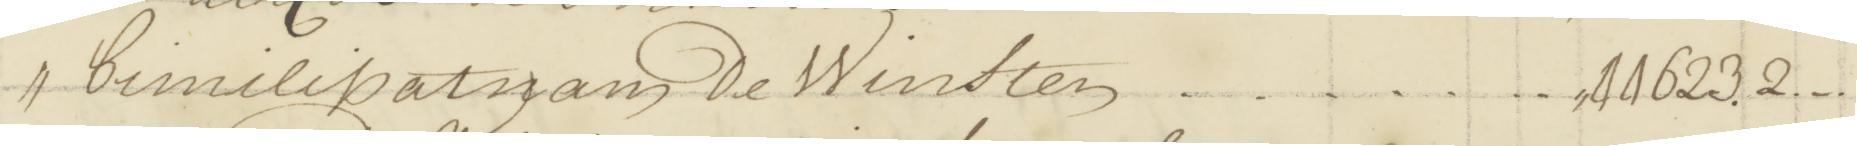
„bimilipatnam de Winsten . . . . . . . „44623.2.-.
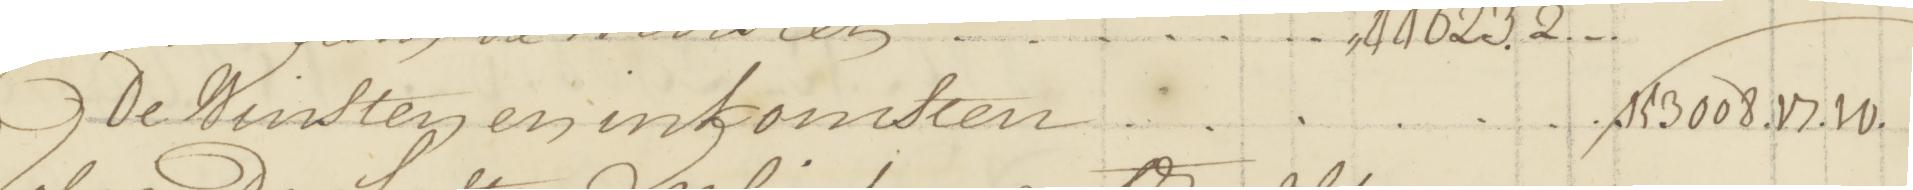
de Winsten en inkomsten . . . . . . . ƒ153008.17.10.
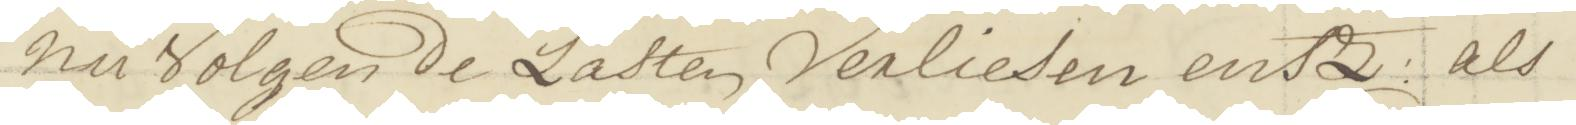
nu volgen de Lasten verliesen ensz: als
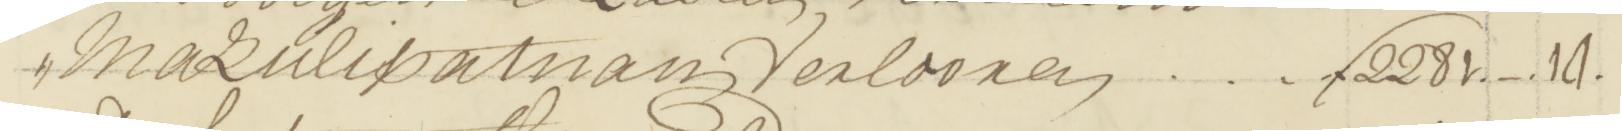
„mazulipatnam Verlooren . . . ƒ2281.-. 14.
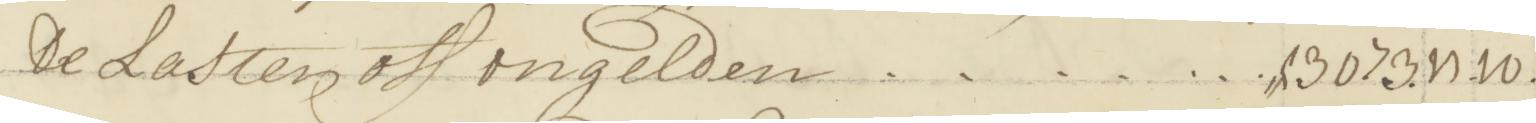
de Lasten off ongelden . . . . . . . „53073.11.10
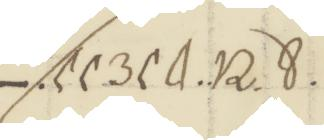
ƒ55354.12.8.
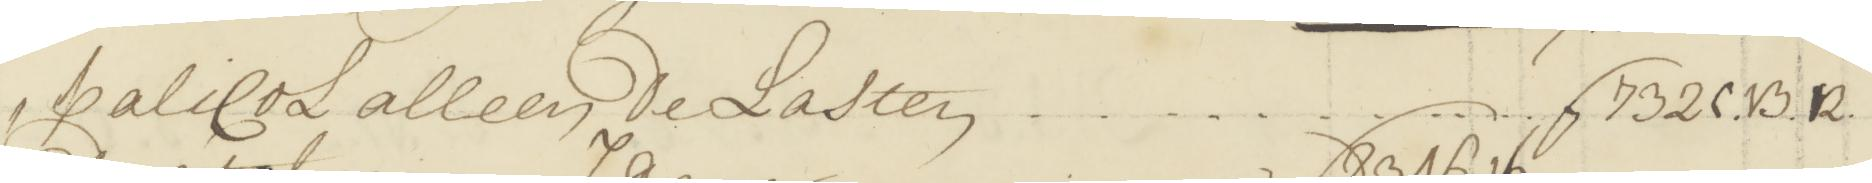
„ palicol alleen de Lasten . . . . . . . . . . . ƒ7325.13.12.
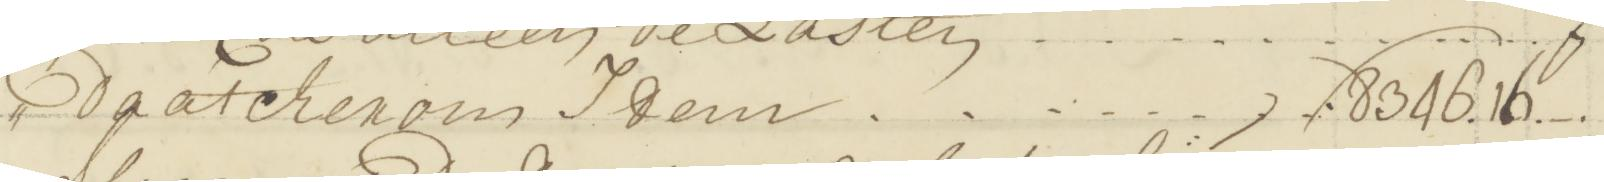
„ daatcherom Idem . . . . . . . ƒ: 8346.16.-.
